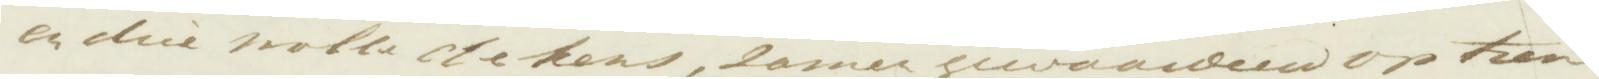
en drie wolle dekens, zamen gewaardeerd op tien
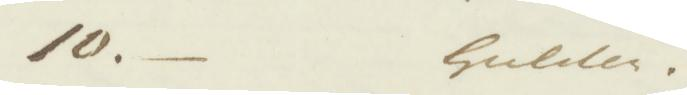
10. — Gulden.
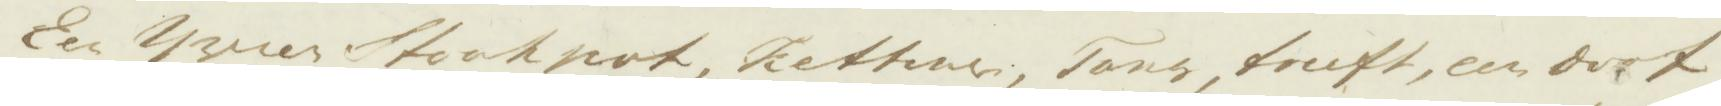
Een IJzeven stookpot, ketting, Tang, treeft, een doof
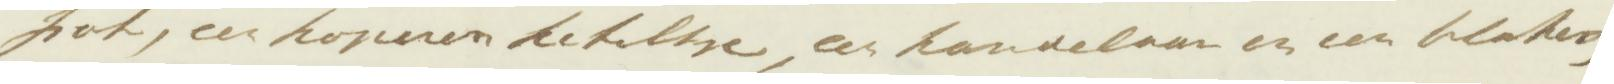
pot, een koperen keteltje, een kandelaar en een blaker
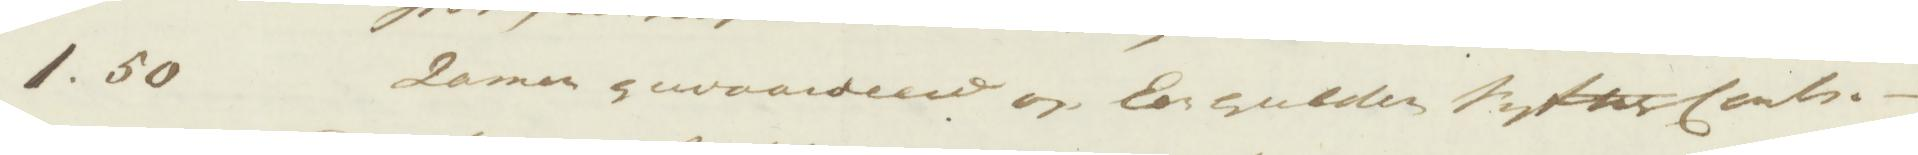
1. 50 zamen gewaardeerd op Een gulden Vyftig Cents.
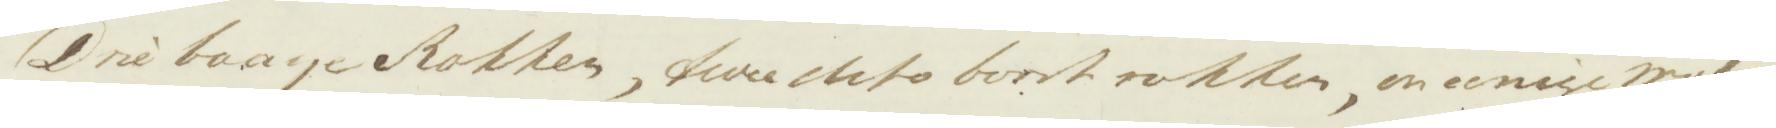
Drie baaye Rokken, Twee dito borst rokken, en eenige wolle
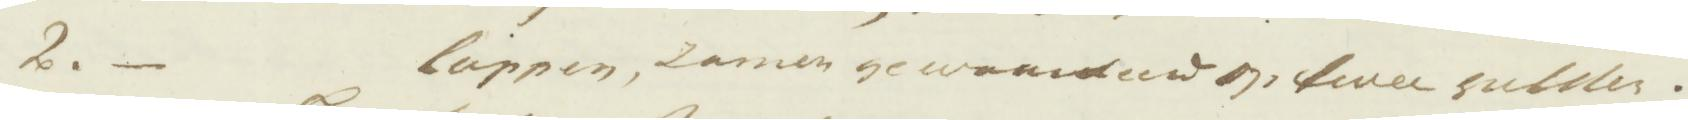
2. — lappen, zamen gewaardeerd op twee gulden
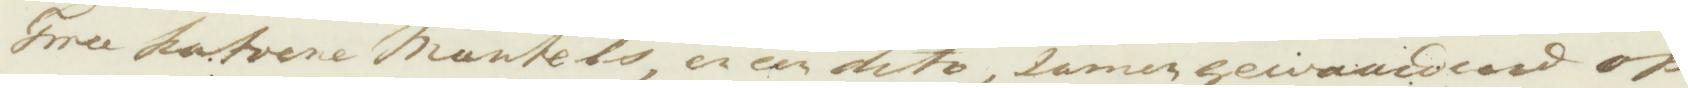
Twee katoene Mantels, en een dito, zamen gewaardeerd op
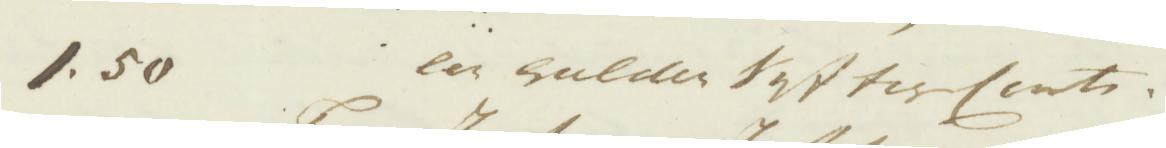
1. 50 een gulden Vyftig Cents.
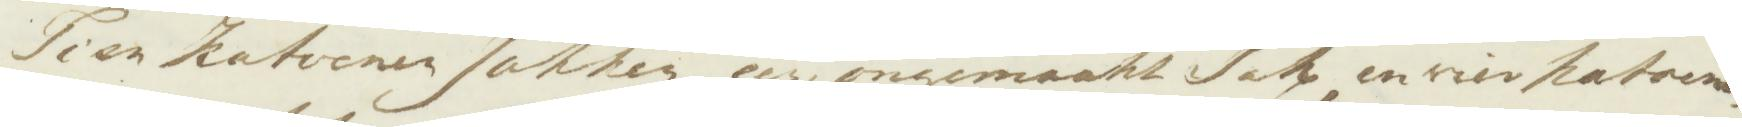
Tien katoenen Jakken, een ongemaakt Jak, en vier katoenen
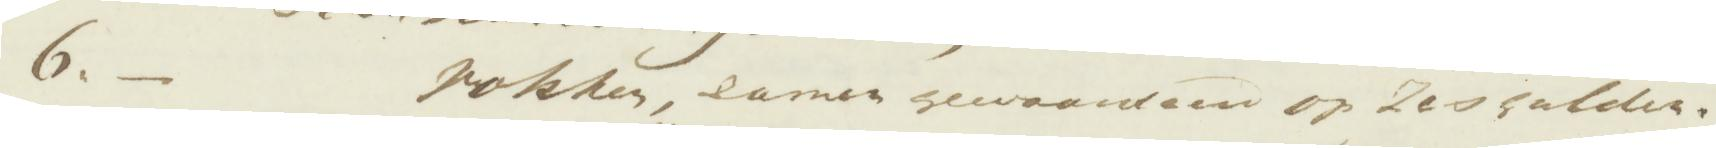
6. — rokken, zamen gewaardeerd op zes gulden.
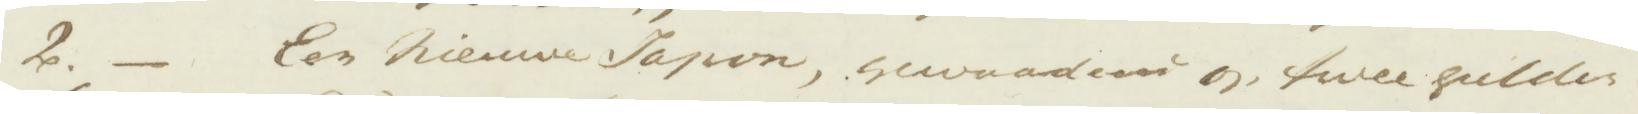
2. — Een nieuwe Iapon, gewaadeerd op Twee gulden
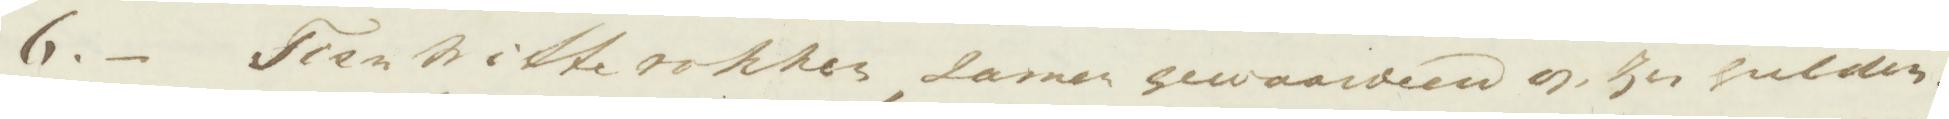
6. — Tien witte rokken, zamen gewaardeerd op zes gulden
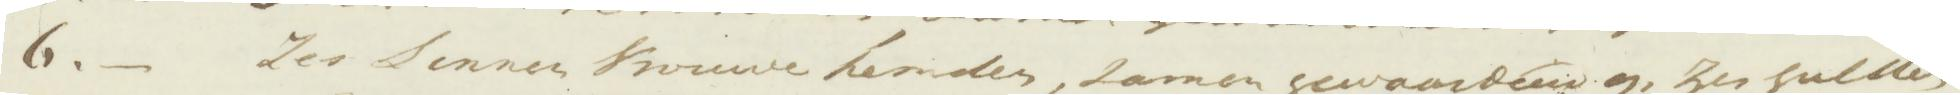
6. — Zes Linnen Vrouwe hemden, zamen gewaardeerd op zes gulden
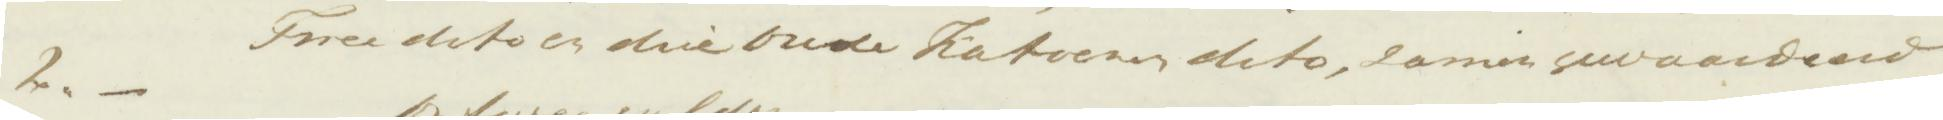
2. — Twee dito en drie oude katoenen dito, zamen gewaardeerd
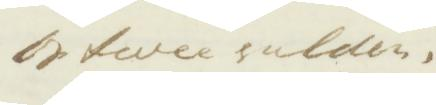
Op twee gulden
